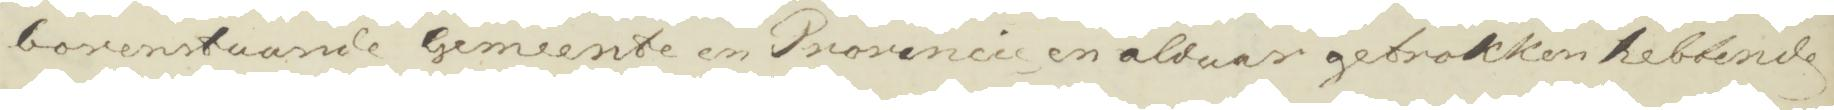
bovenstaande Gemeente en Provincie en aldaar getrokken hebbende
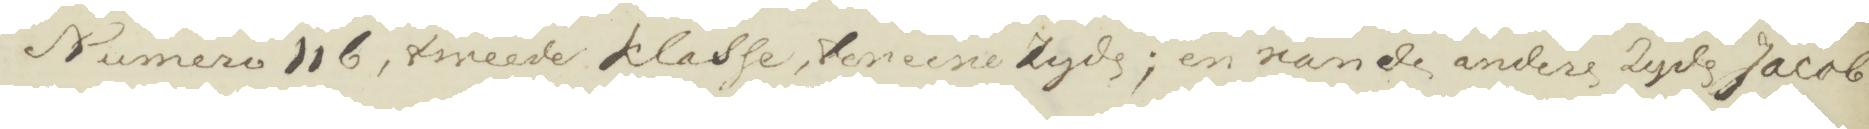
Numero 116, tweede klasse, ter eene zyde; en van de andere zyde Jacob
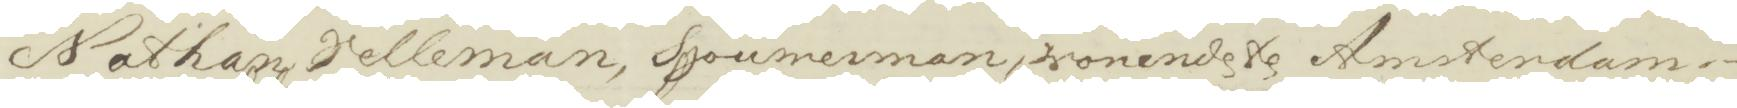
Nathan Velleman, Spouwerman, wonende te Amsterdam,
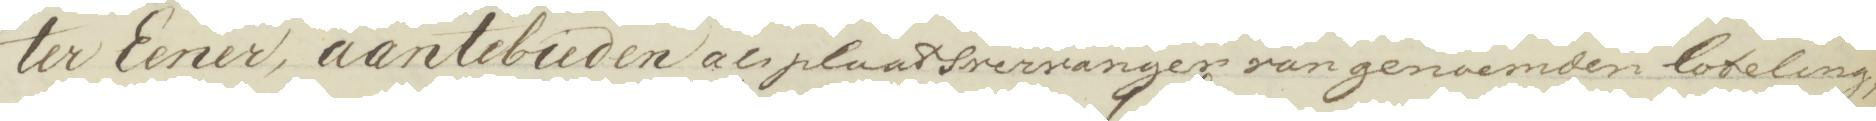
ter Eener, aantebieden als plaats vervanger van genoemden loteling
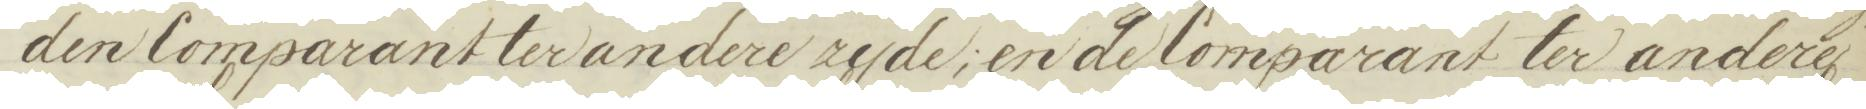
den Comparant ter andere zyde, en de Comparant ter andere
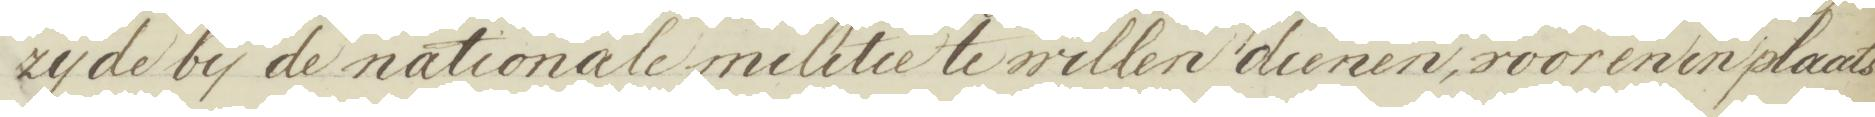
zyde by de nationale militie te willen dienen, voor en in plaats
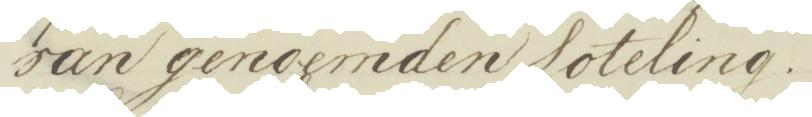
van genoemden Loteling.
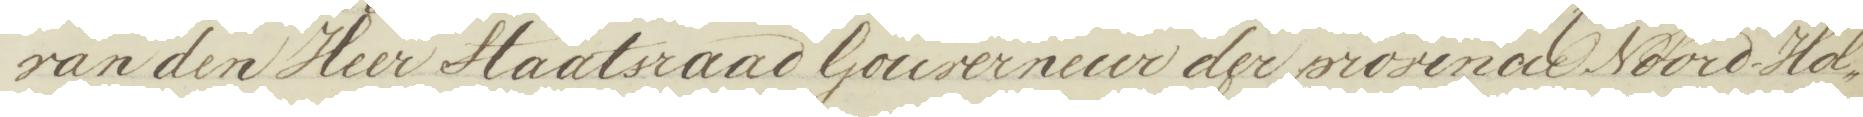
van den Heer Staatsraad Gouverneur der provencie Noord Hol„
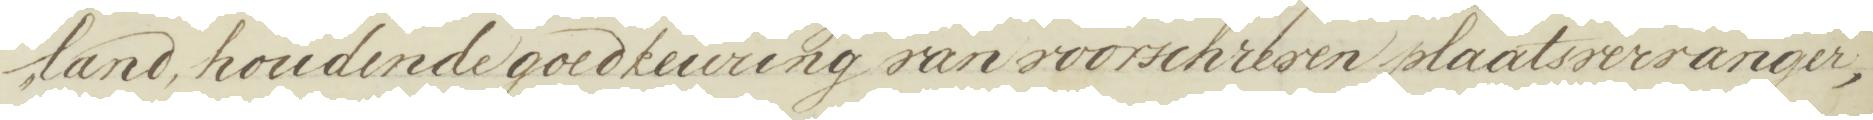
„land, houdende goedkeuring van voorschreven plaatsvervanger,
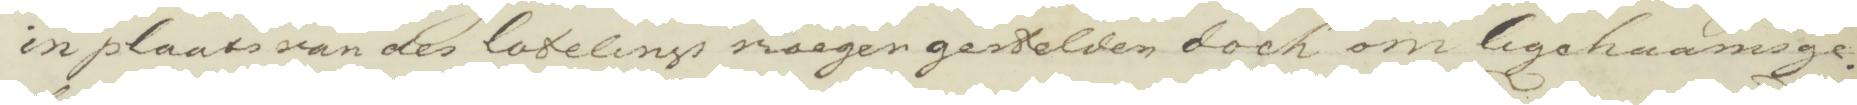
in plaats van des lotelings vroeger gestelden doch om ligehaams ge
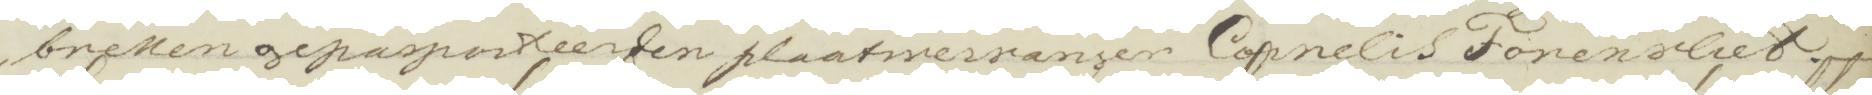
breken gepasporteerden plaatsvervanger Cornelis Torenvliet.
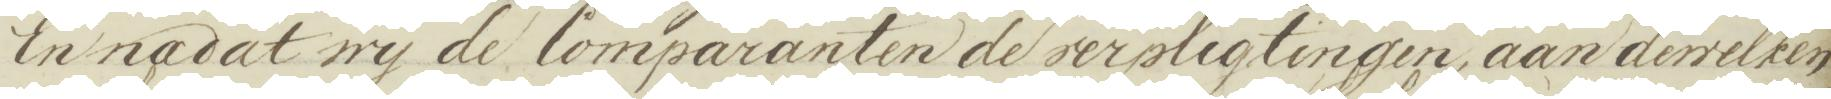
En nadat wy de Comparanten de verpligtingen, aan dewelken
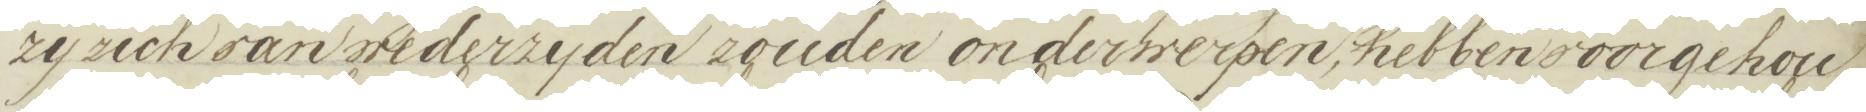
zy zich van wederzyden zouden onderwerpen, hebben voorgehou
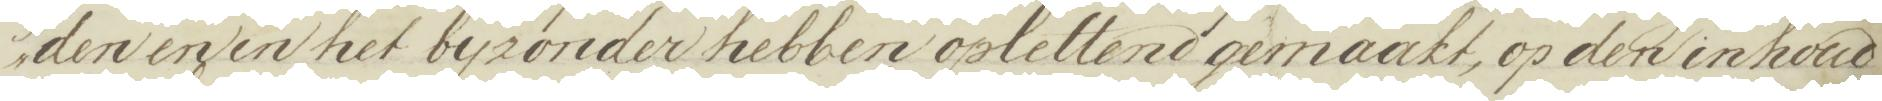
„den en in het byzonder hebben oplettend gemaakt, op den inhoud
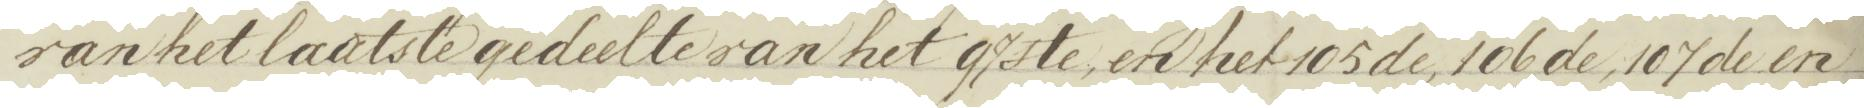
van het laatste gedeelte van het 97ste, en het 105de, 106de, 107de en
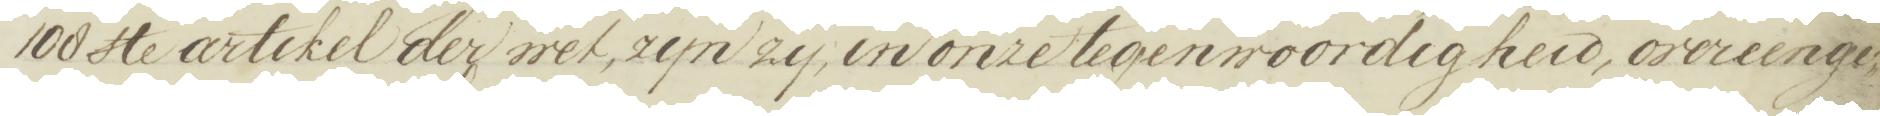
108ste artikel der wet, zyn zy, in onze tegenwoordigheid, over eenge
